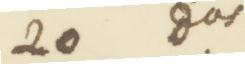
20 d:os
